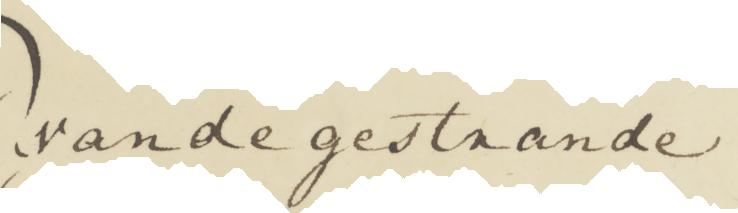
van de gestrande
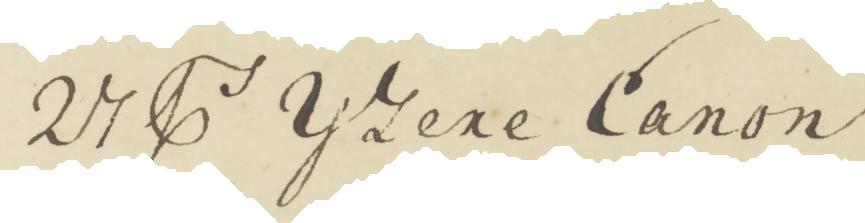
27 ps Yzere Canon
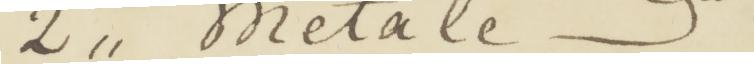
2 „ metale _to
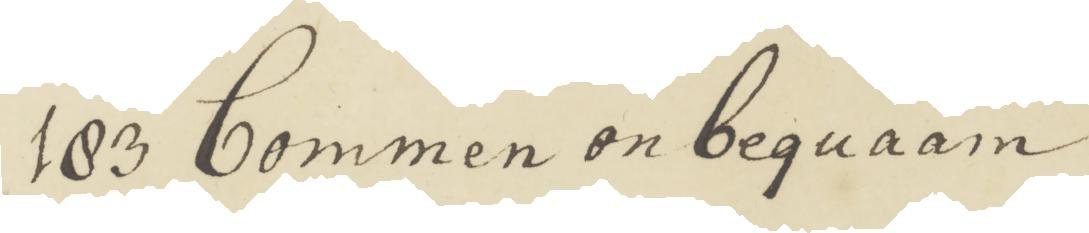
183 bommen onbequaam
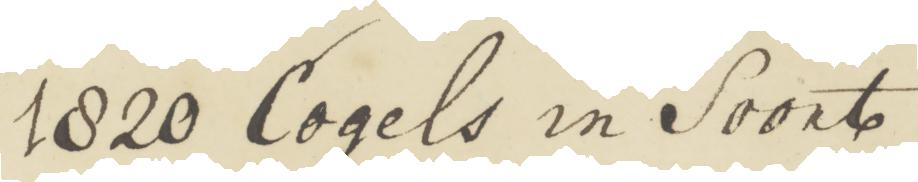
1820 Cogels in soort
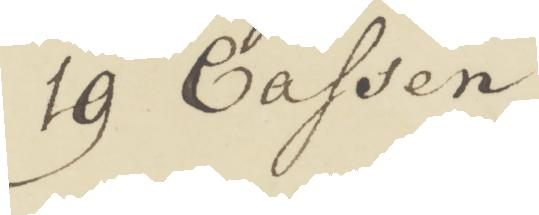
19 Cassen
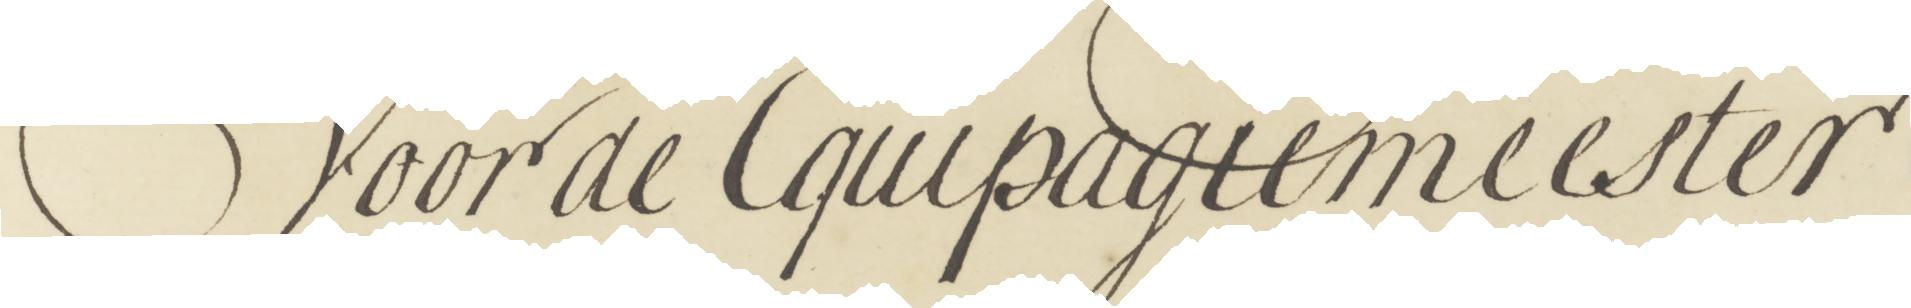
Voor de Equipagiemeester
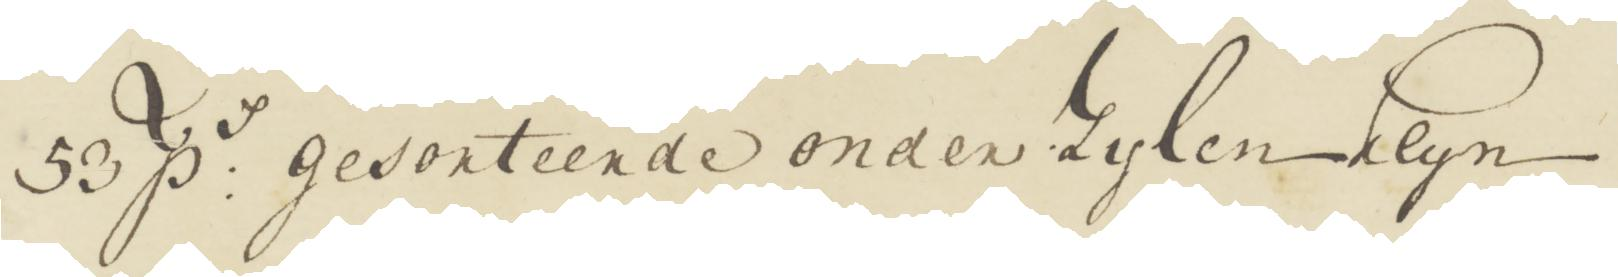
53 p:s gesorteerde onder zylen klyn
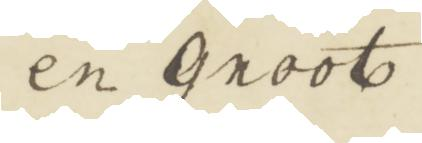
en groot
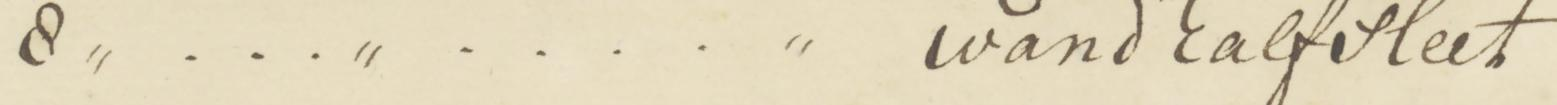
8 „ - - - „ - - - - „ wand halfsleet
